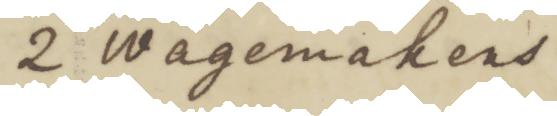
2 wagemakers
